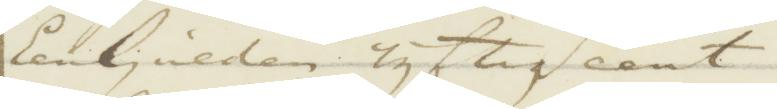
Een Gulden vijftig cent
